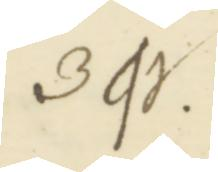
341.
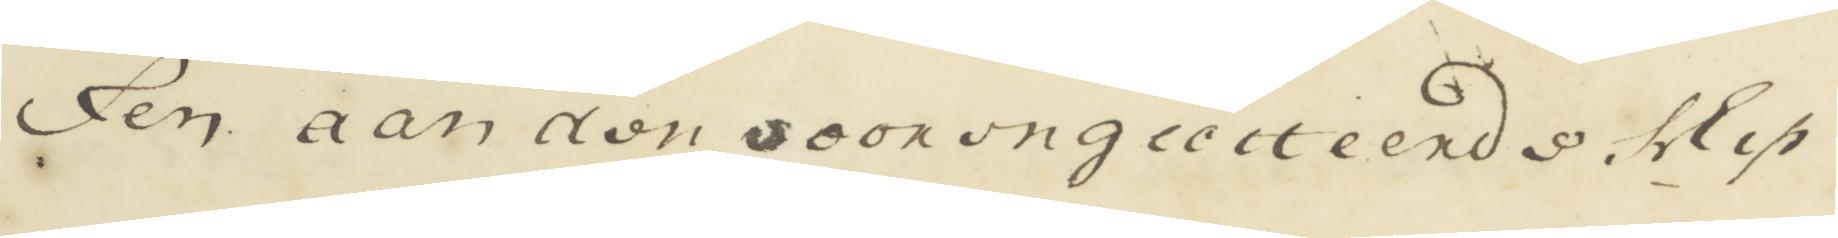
Een aan den vooren geciteerde schip
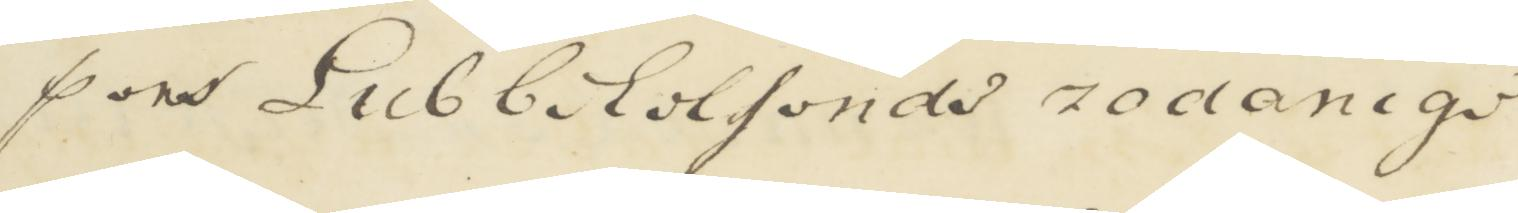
pers Lub behelsende zodanige
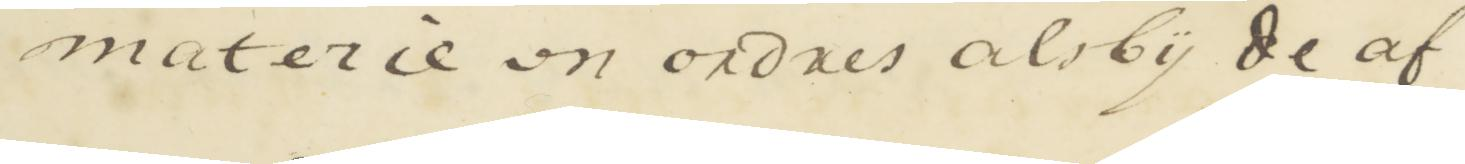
materie en ordres als bij de af
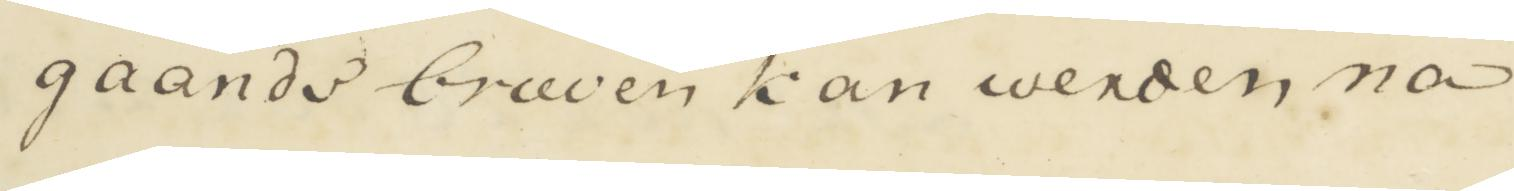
gaande brieven kan werden na
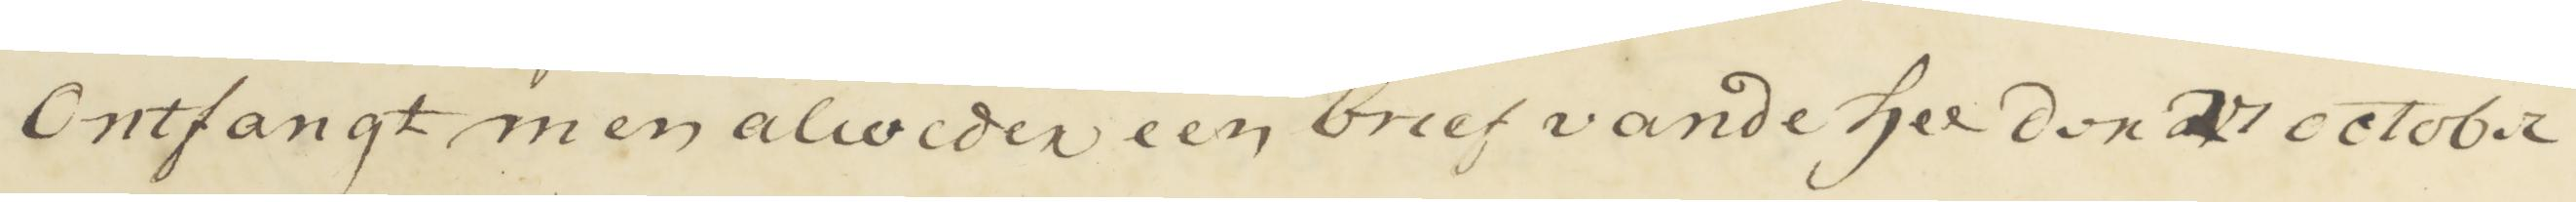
Ontfangt men alweder een brief vande hee den 27 october
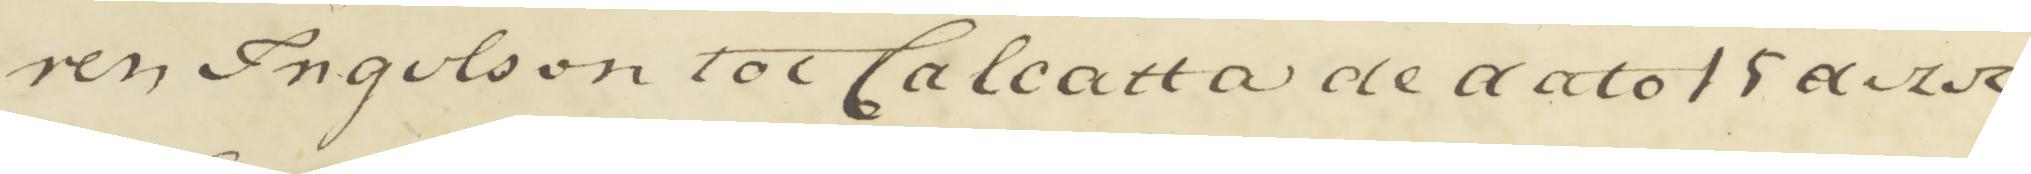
ren Engelsen tot Calcatta de dato 15 dezer
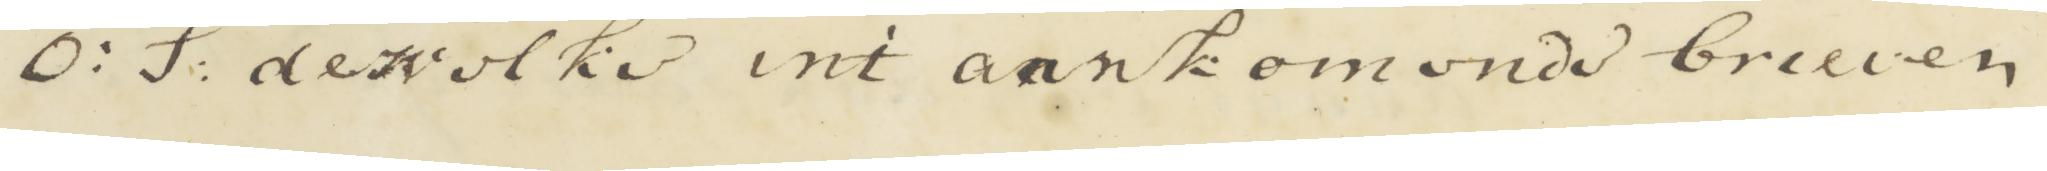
O: S: de welke in't aankomende brieven
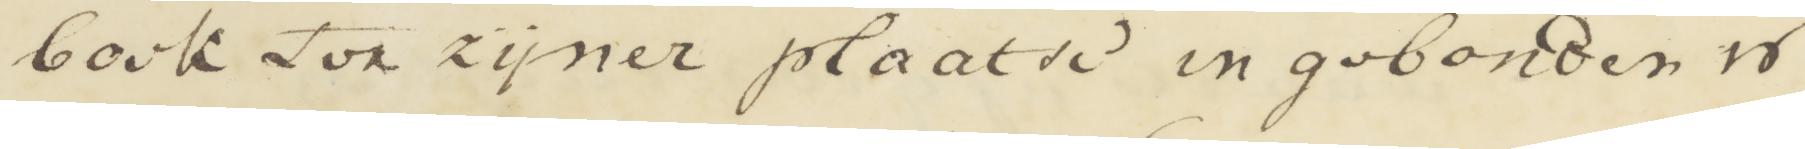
boek ter zijner plaatse in gebonden is
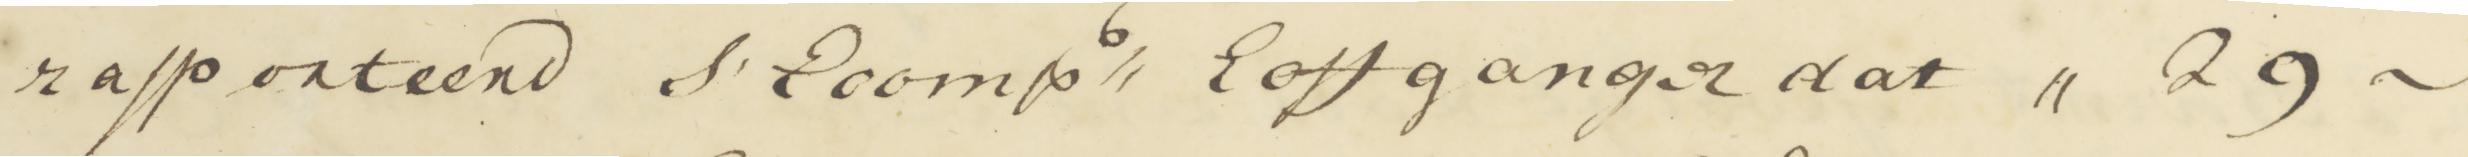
rapporteerd 's Ecomp„s hoffganger dat „ 29 e
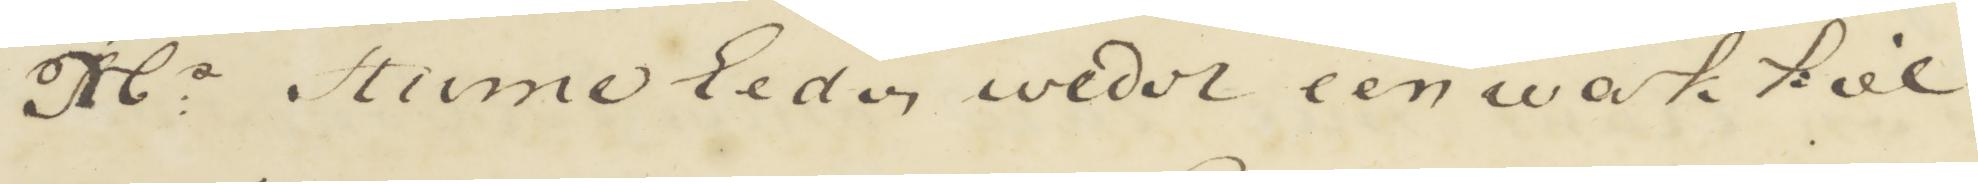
M:s Hume heden weder een wakkiel
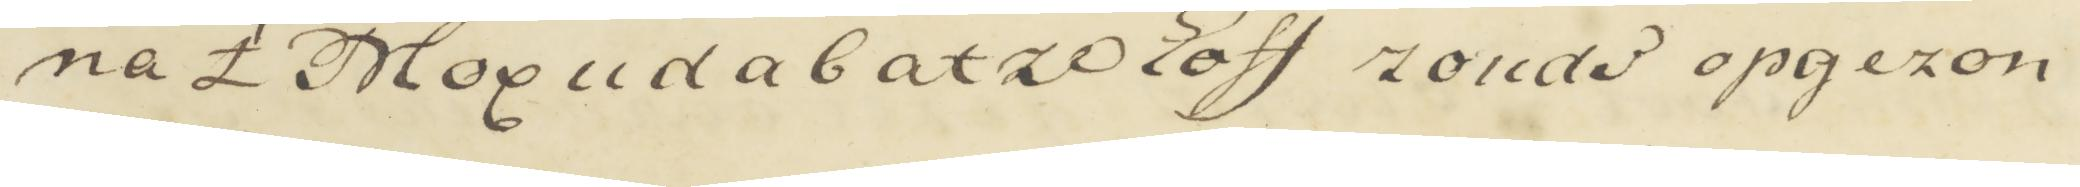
na 't Moxudabatze hoff zoude opgezon
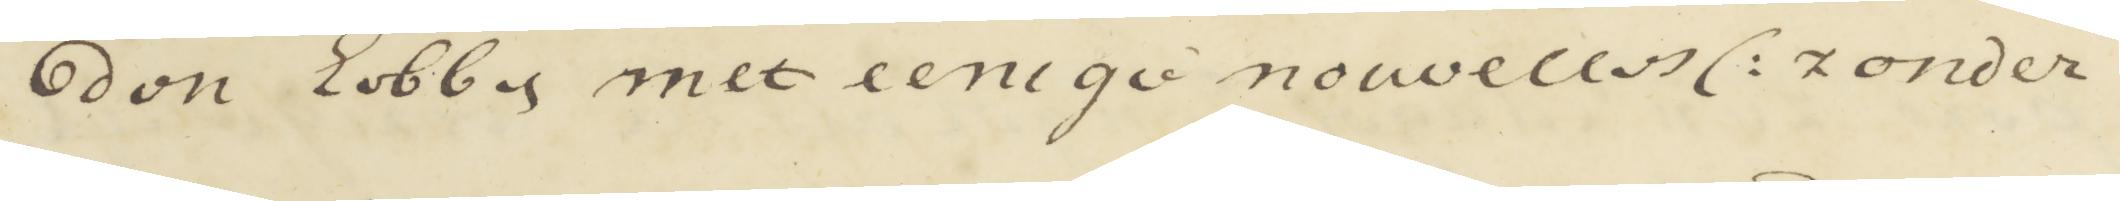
den hebben met eenige nouvelles (:zonder
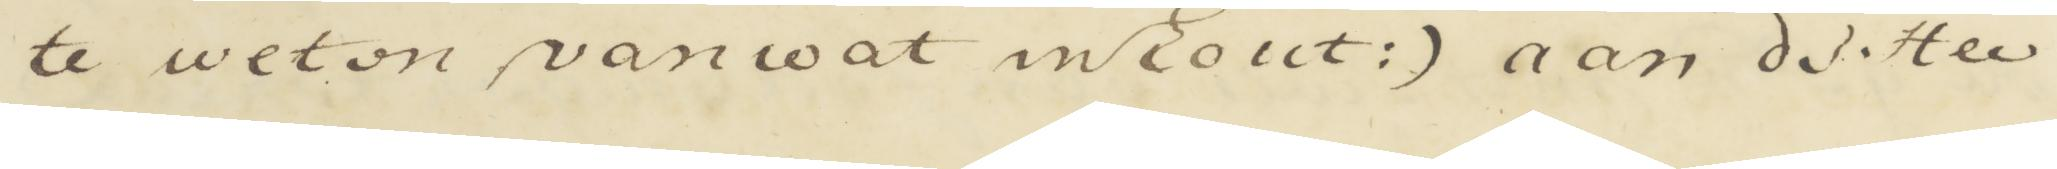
te weten van wat inhout:) aan de Hee
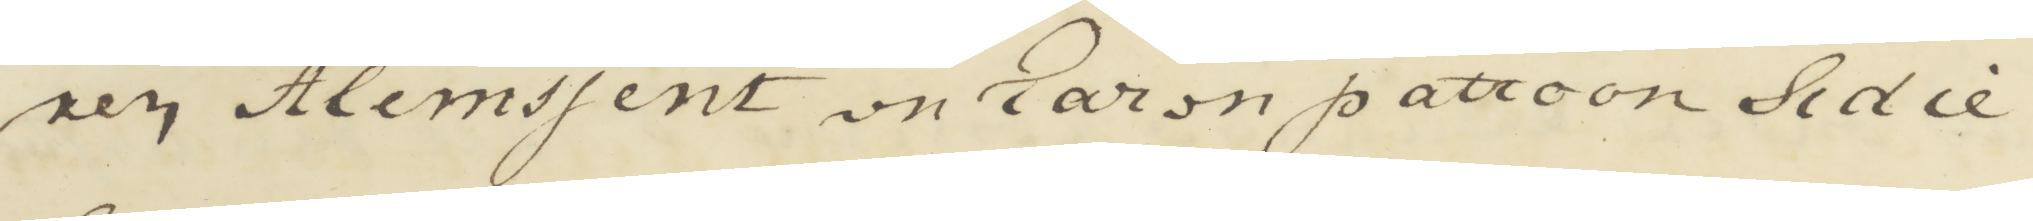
ren Alemssent en haren patroon Sidie
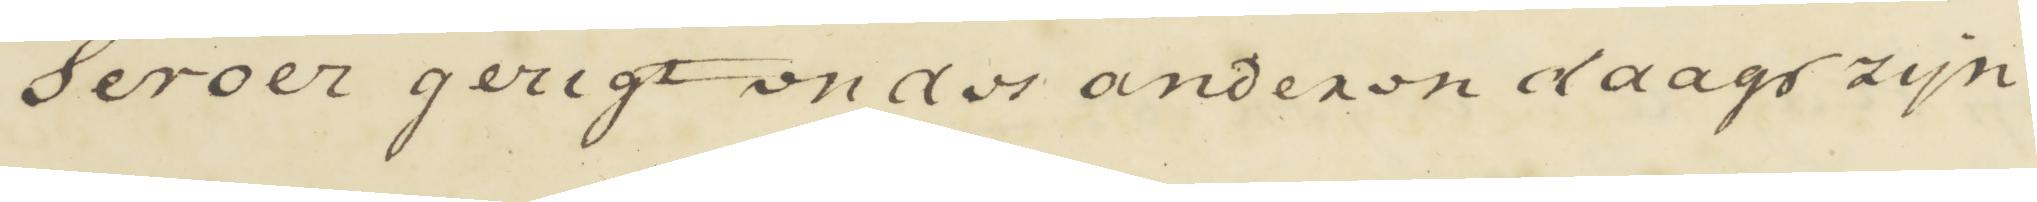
Sevoer gerigt en des anderen daags zijn
